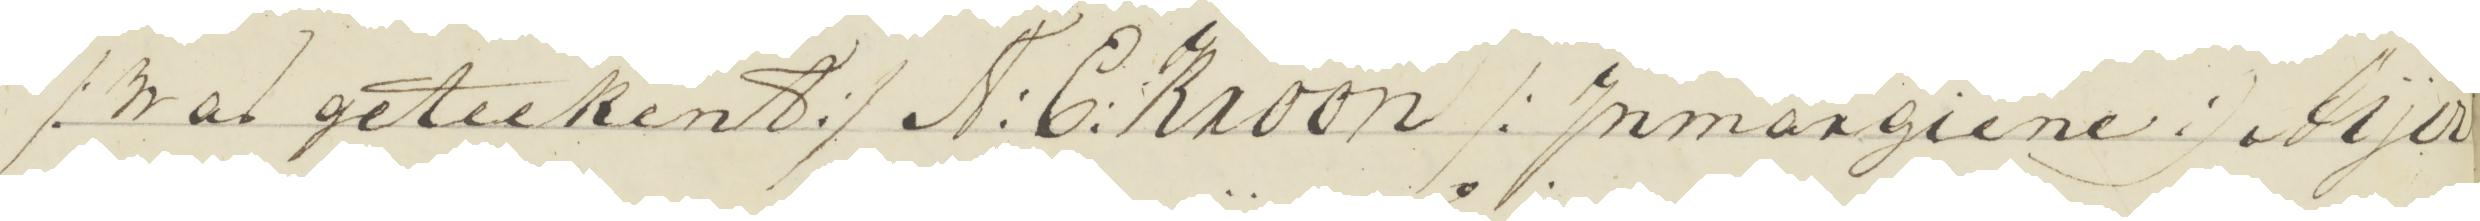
/:was geteekent:/ N: E: Kroon /:Jnmargiene:/ Aijer
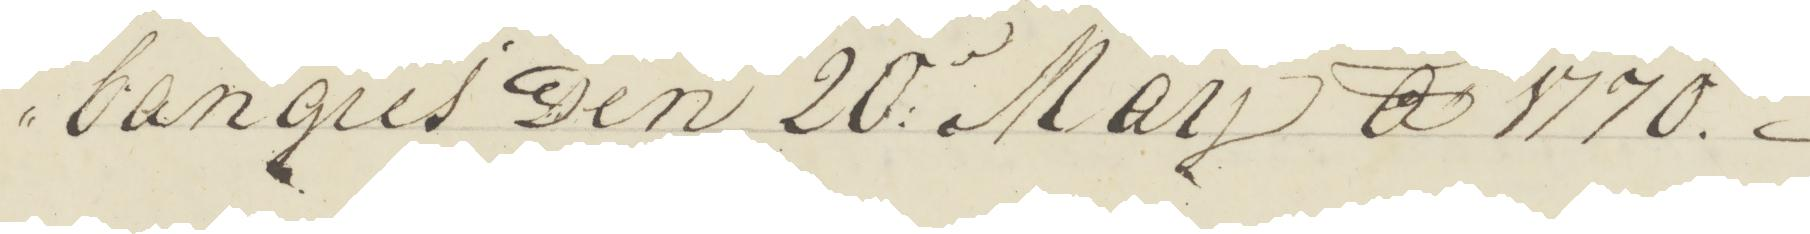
„bangies Den 20:' Maij a„o 1770.
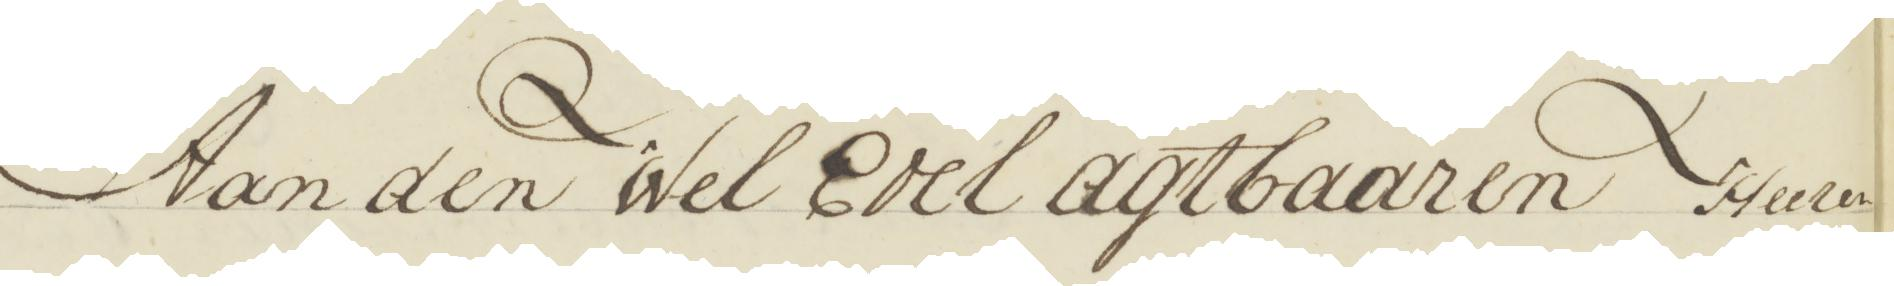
Aan den wel Edel agtbaaren Heeren
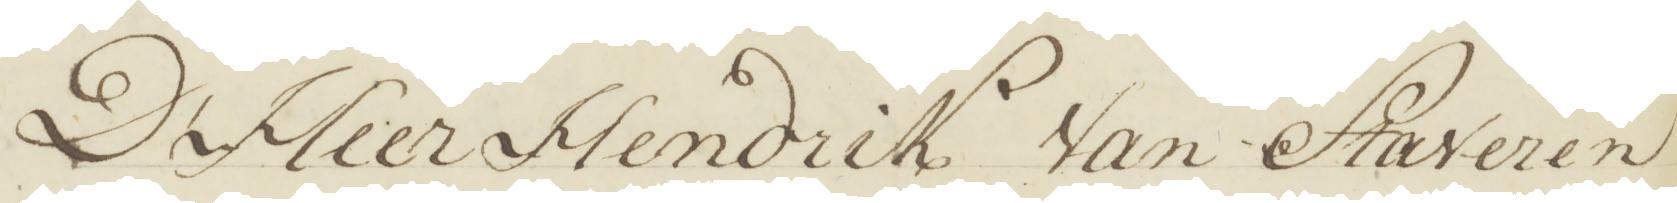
D' Heer Hendrik van Staveren
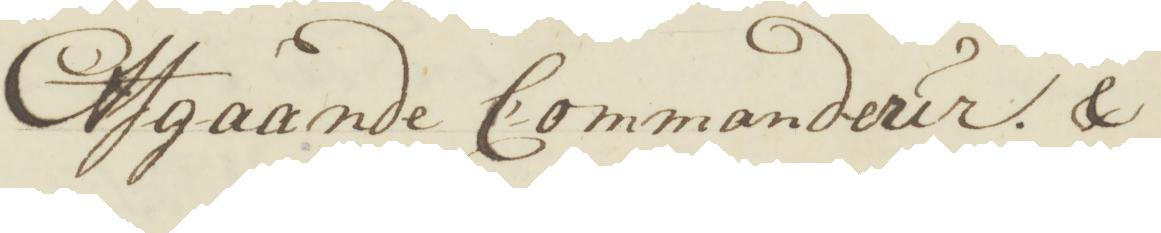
Affgaande Commandeur. &
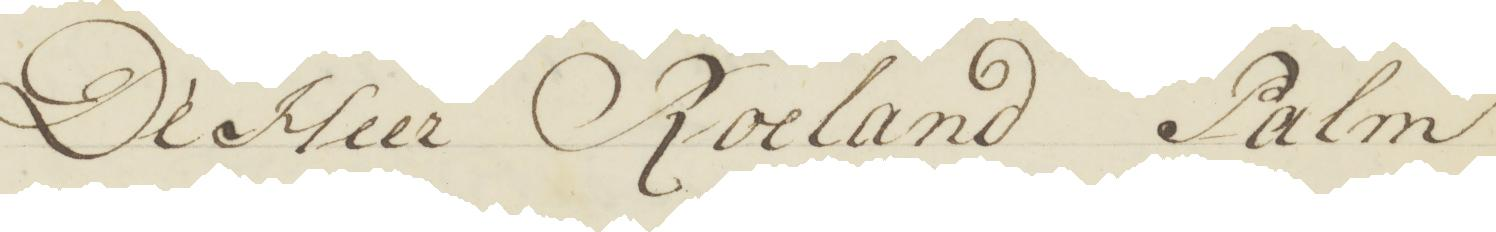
De Heer Roeland Palm
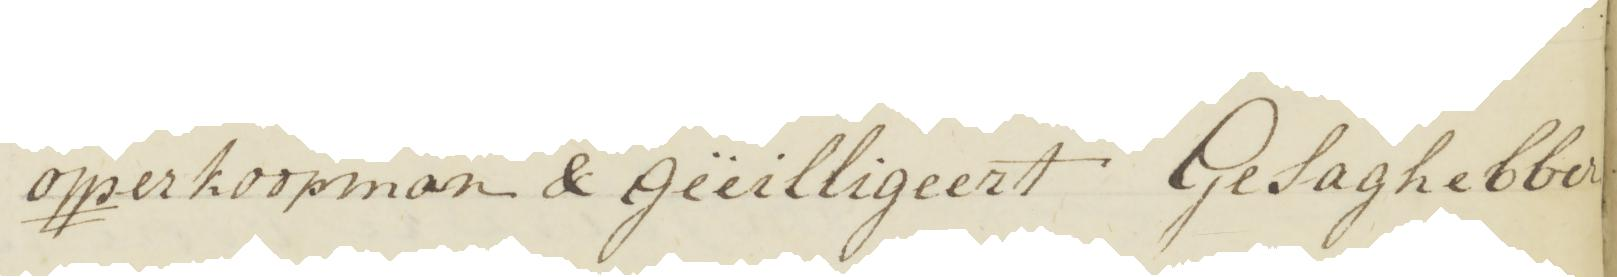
opperkoopman & geëilligeert Gesaghebber
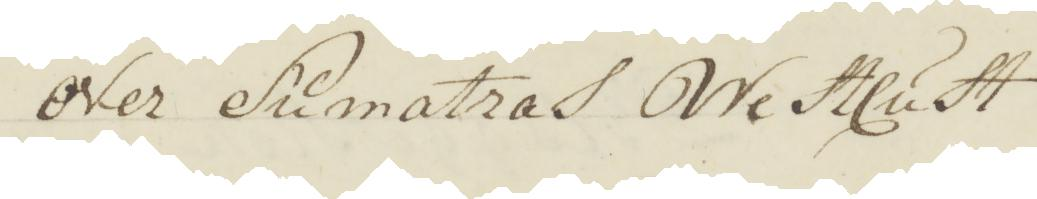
over Sumatras Westcust
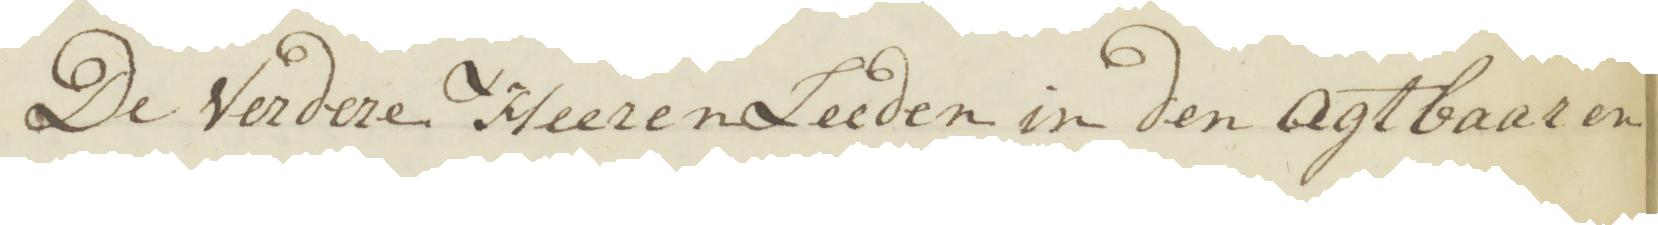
De verdere Heeren Leeden in den agtbaaren
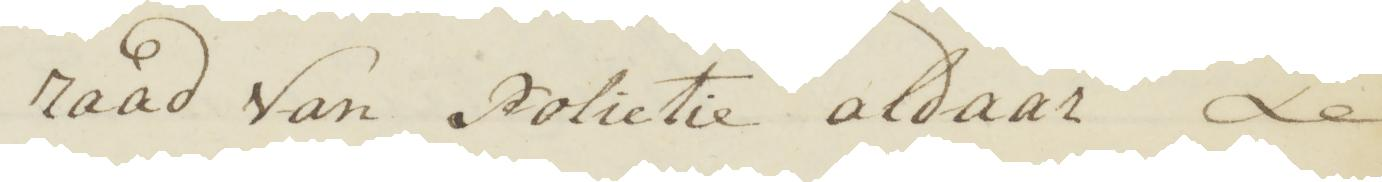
raad van Polietie aldaar
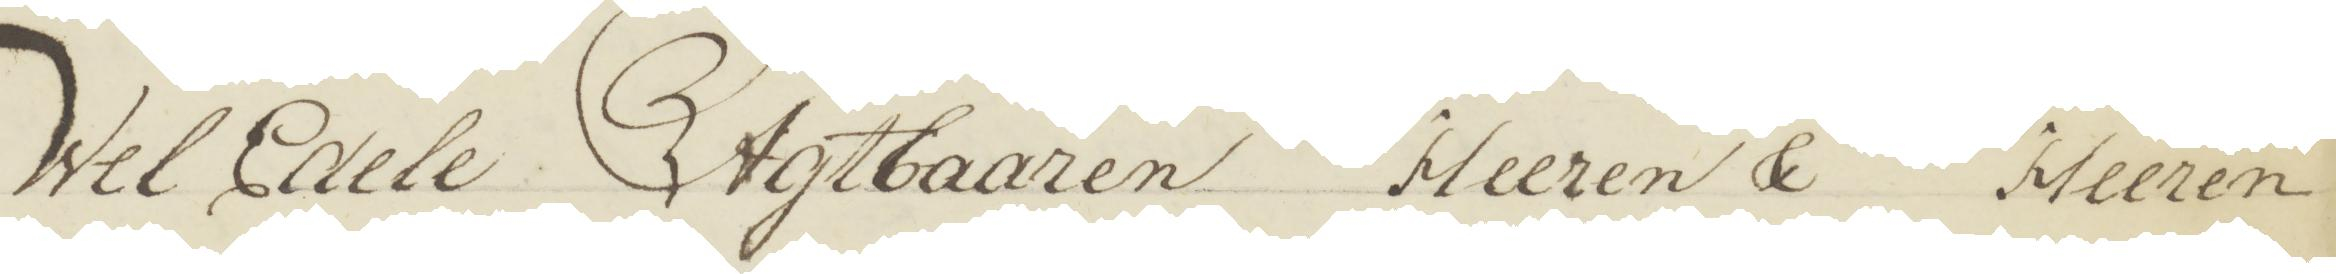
Wel Edele Agtbaaren Heeren & Heeren
